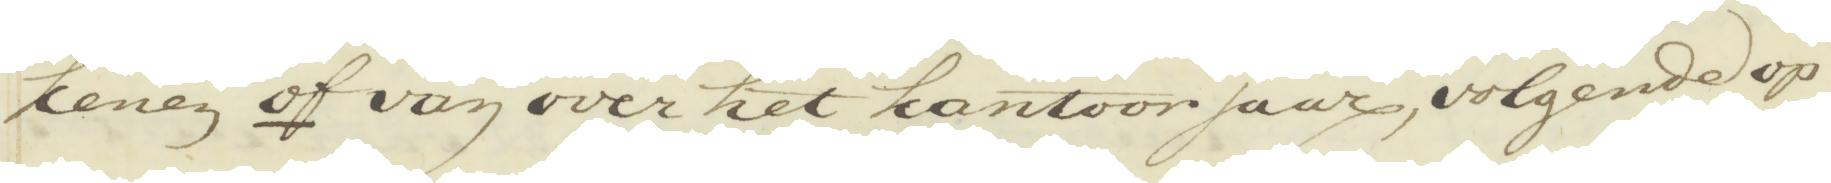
kenen of van over het kantoor jaar, volgende op
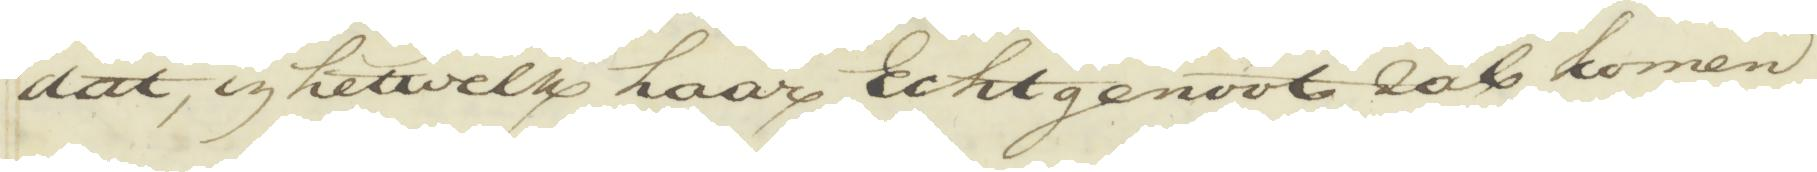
dat, in hetwelk haar Echtgenoot zal komen
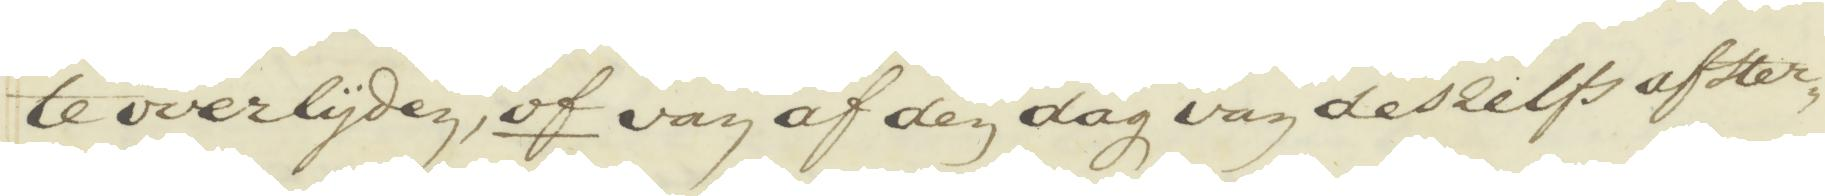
te overlijden, of van af den dag van deszelfs afster„
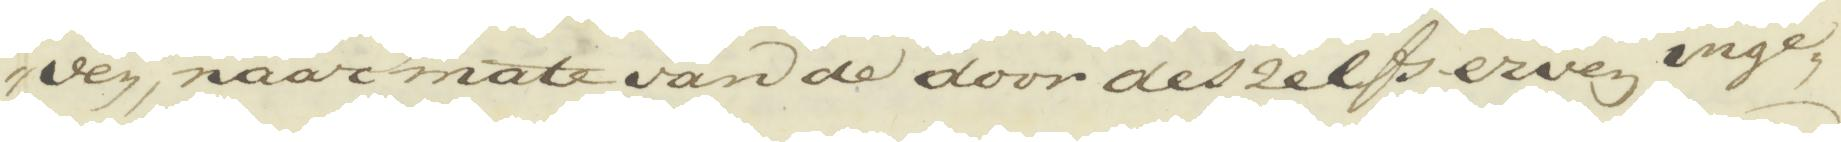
„ven, naar mate van de door deszelfs erven inge„
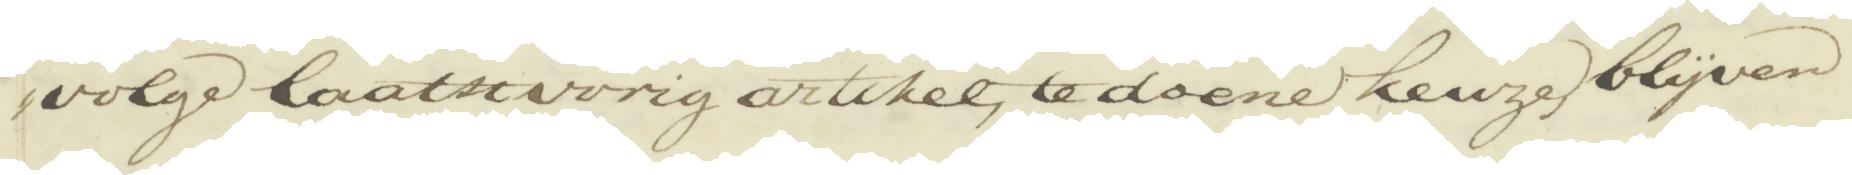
„volge laatstvorig artikel, te doene keuze blijven
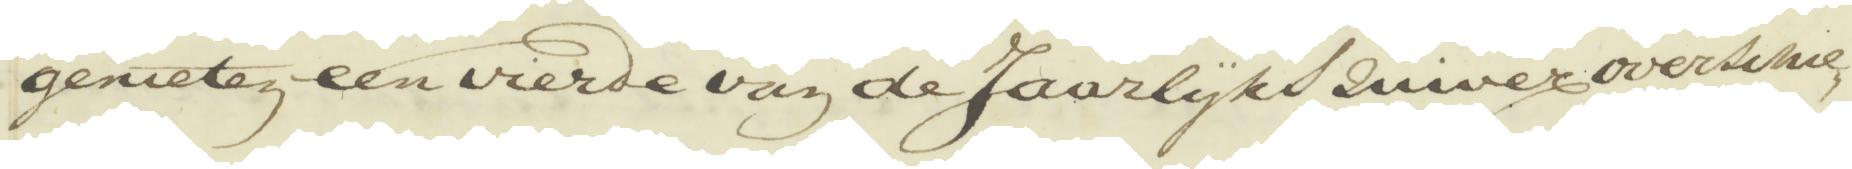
genieten een vierde van de Jaarlijks zuiver overschie„
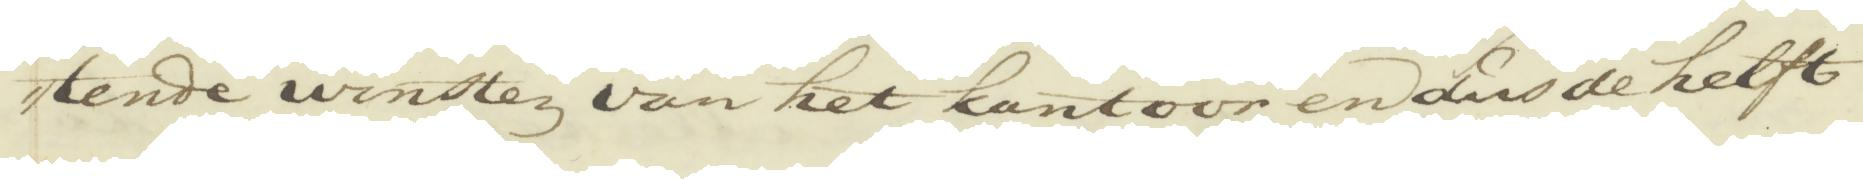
„tende winsten van het kantoor en dus de helft
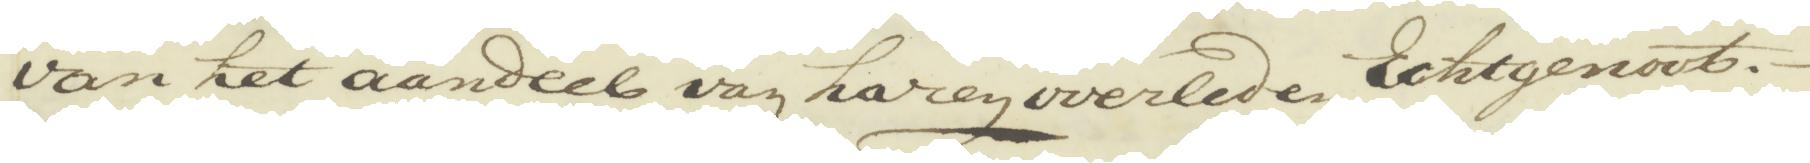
van het aandeel van haren overleden Echtgenoot. —
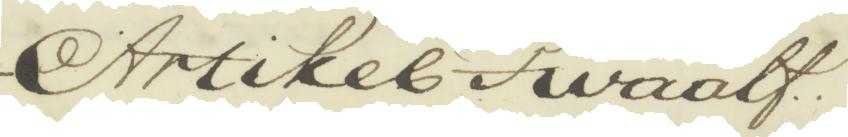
Artikel Twaalf..
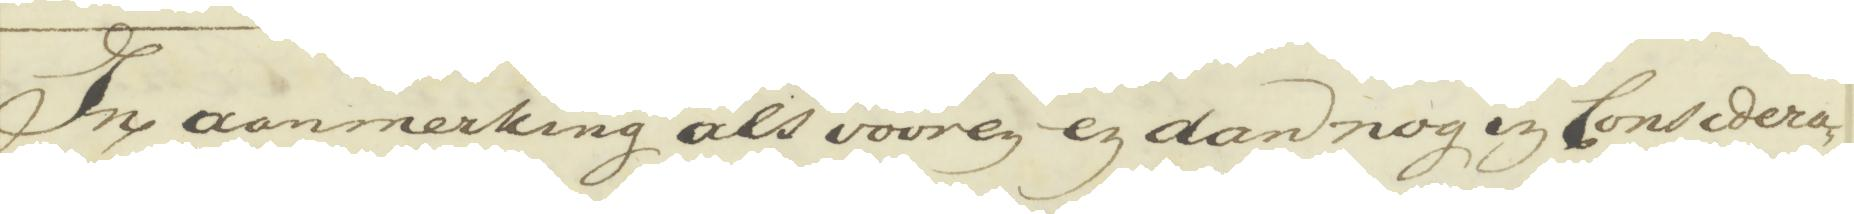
In aanmerking als vooren en dan nog in Considera„
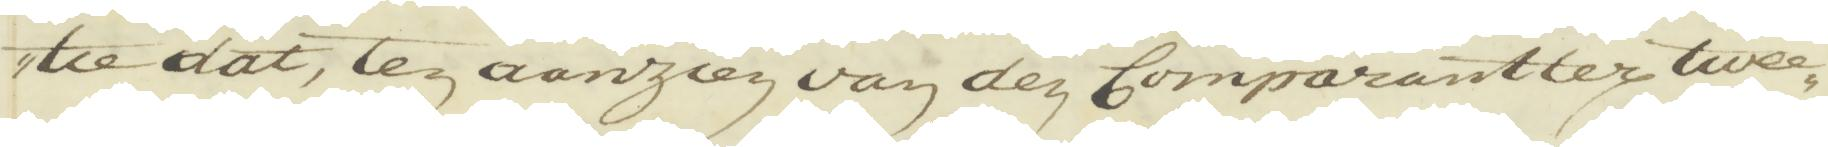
„tie dat, ten aanzien van den Comparant ter twee„
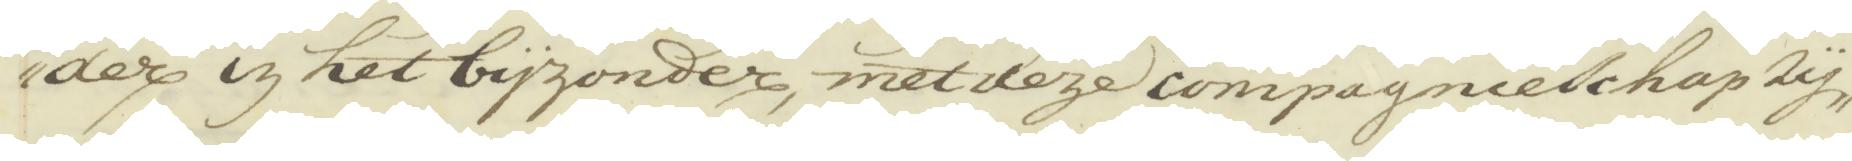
„der in het bijzonder, met deze compagnieschap zij„
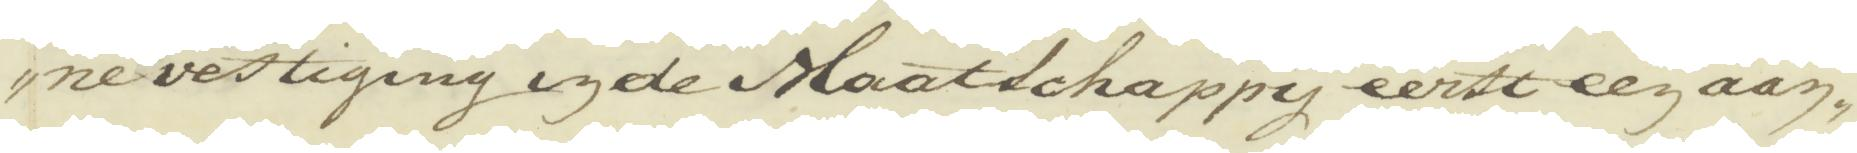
„ne vestiging in de Maatschappij eerst een aan„
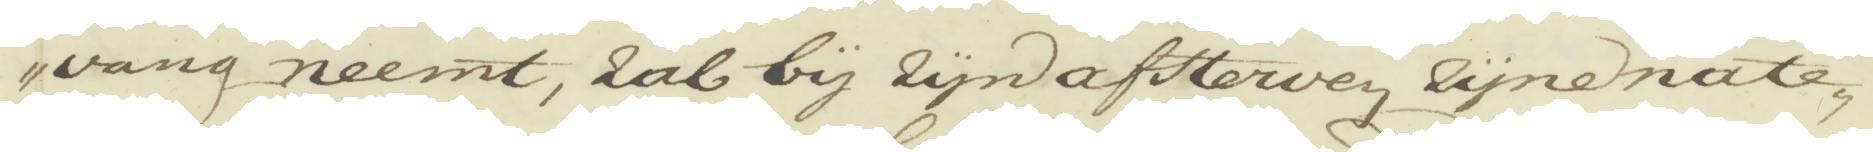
„vang neemt, zal bij zijn afsterven zijne nate„
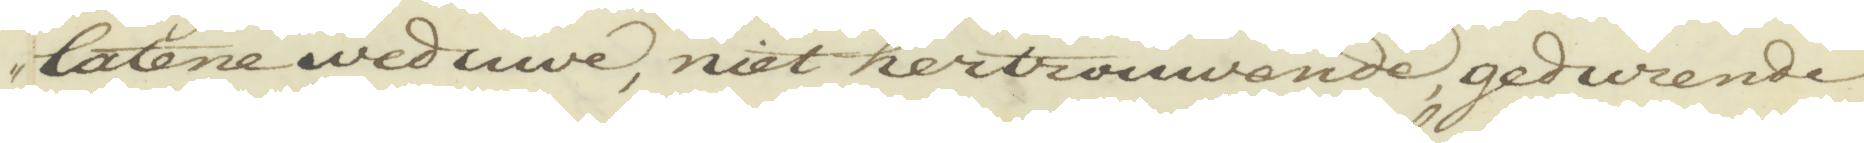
„latene weduwe, niet hertrouwende, gedurende
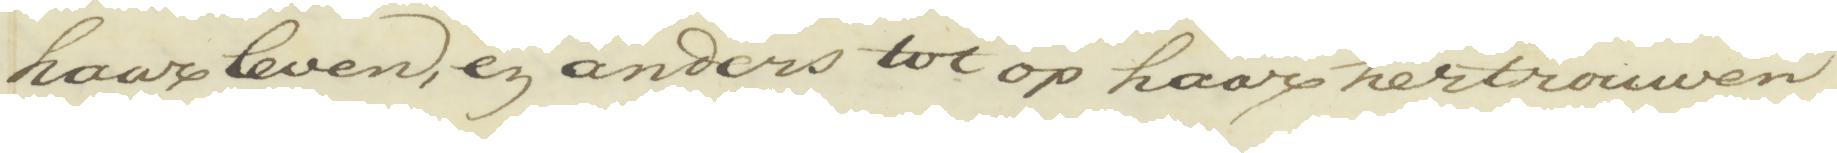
haar leven, en anders tot op haar hertrouwen
